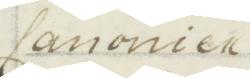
Canonier
